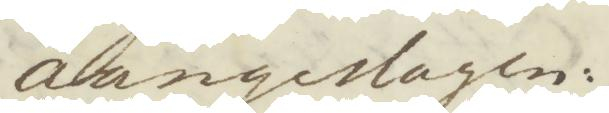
aangeslagen:
